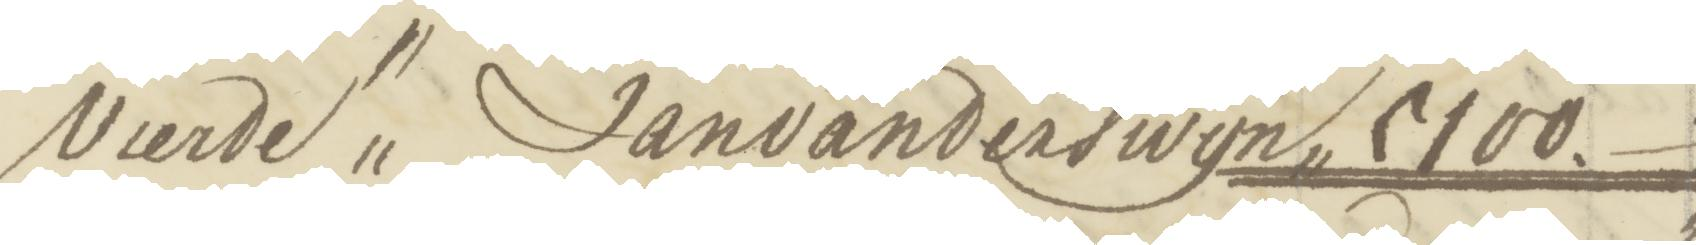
vierde „ Ian vander swijn „ 5100. —
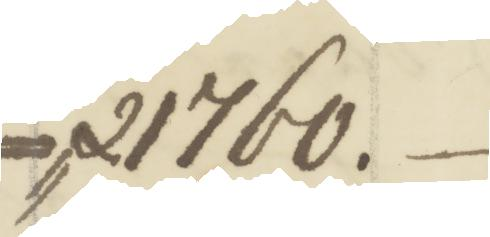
„21760. —
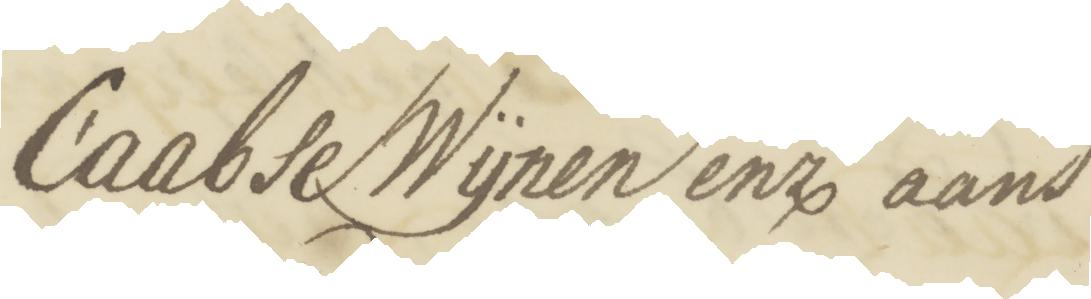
Caabse Wijnen enz aan't
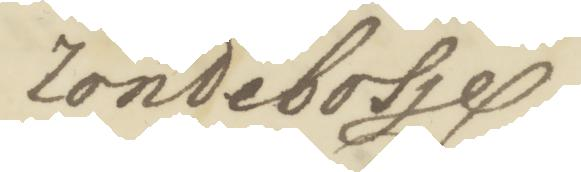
zondebosje
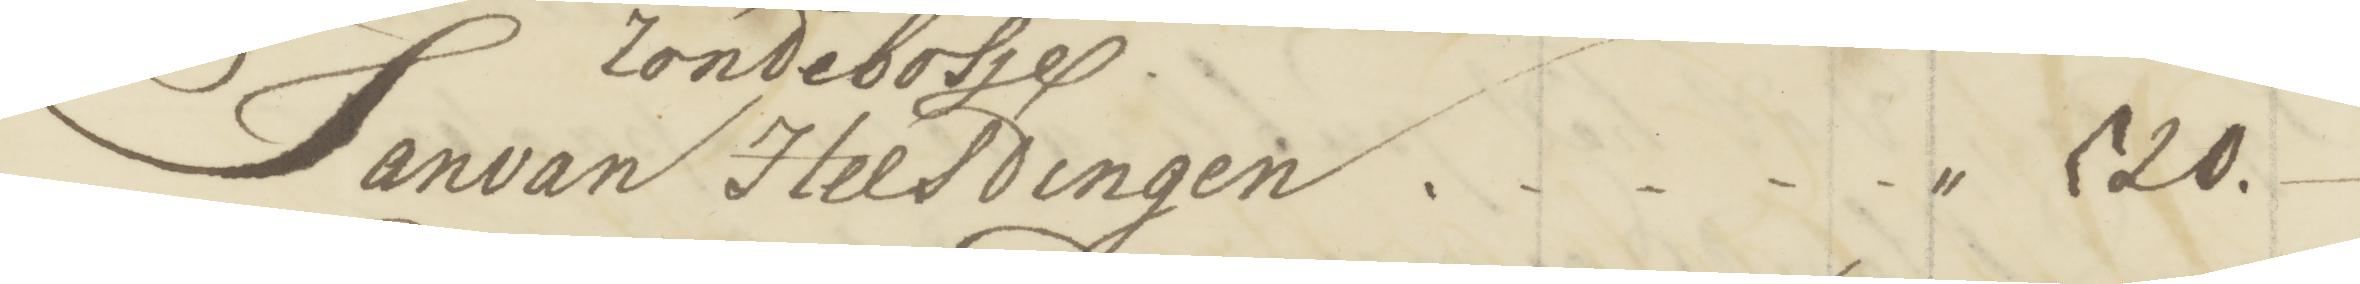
Ian van Heesdingen . - - - - „ 520. —
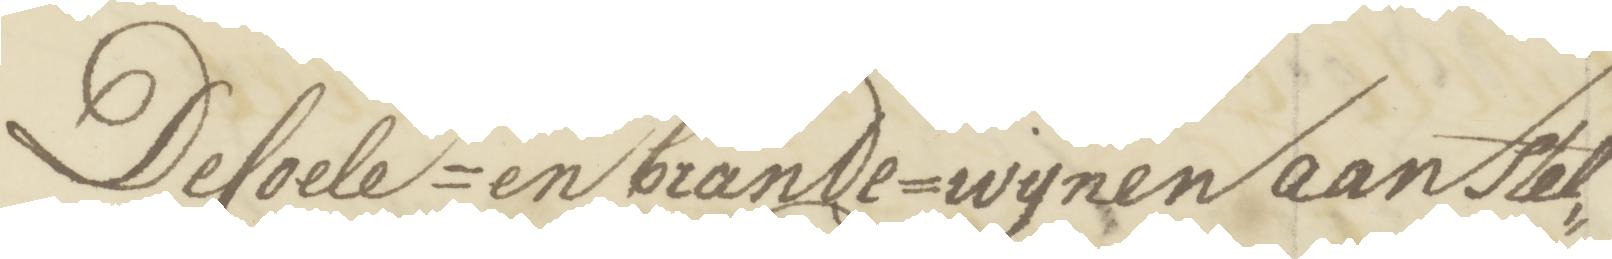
DeCoele = en brande = wijnen aan stel„
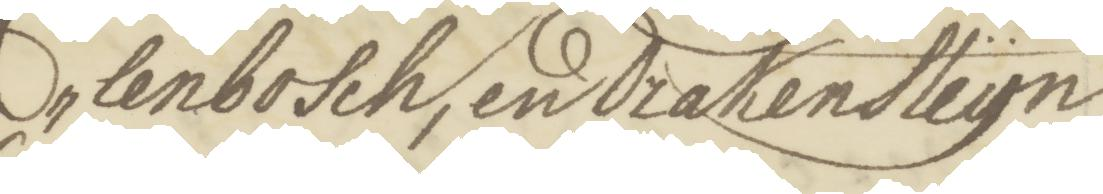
lenbosch, en drakensteijn
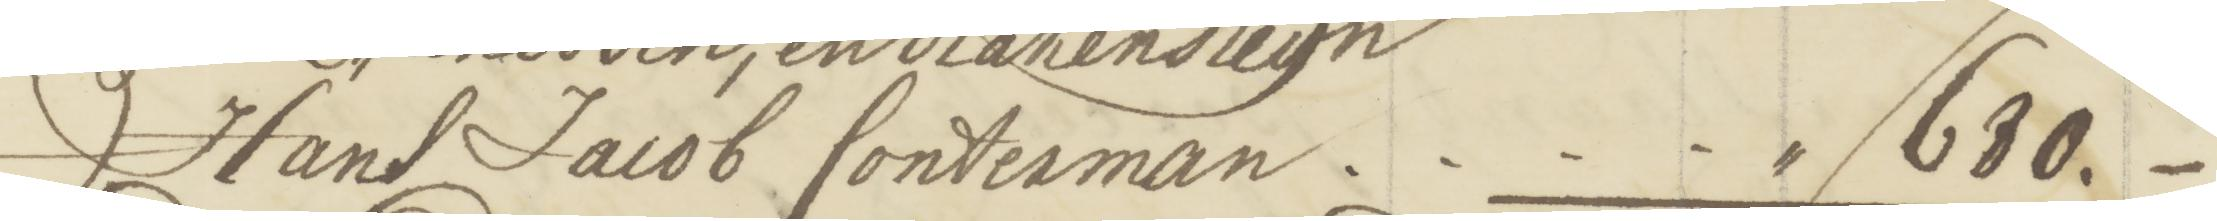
Hans Iacob Conterman . - - - „ 680. —
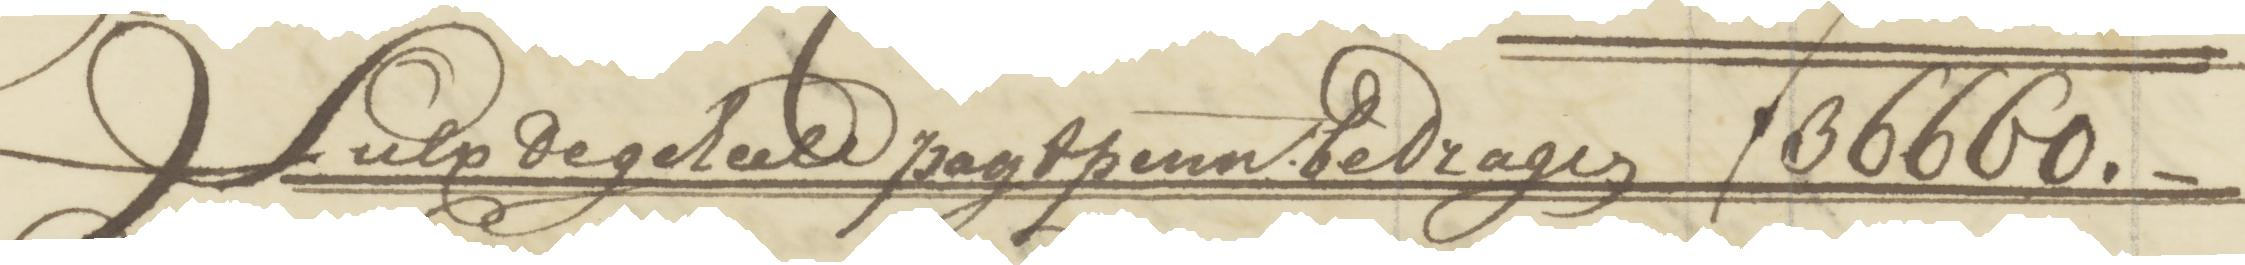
Sulx de geheele pagt penn: bedragen ƒ36660. —
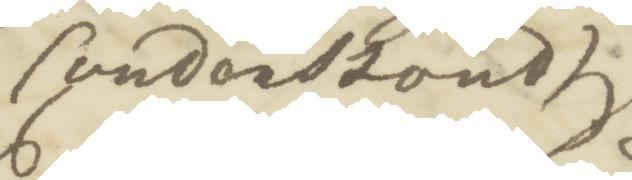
(onderstond)
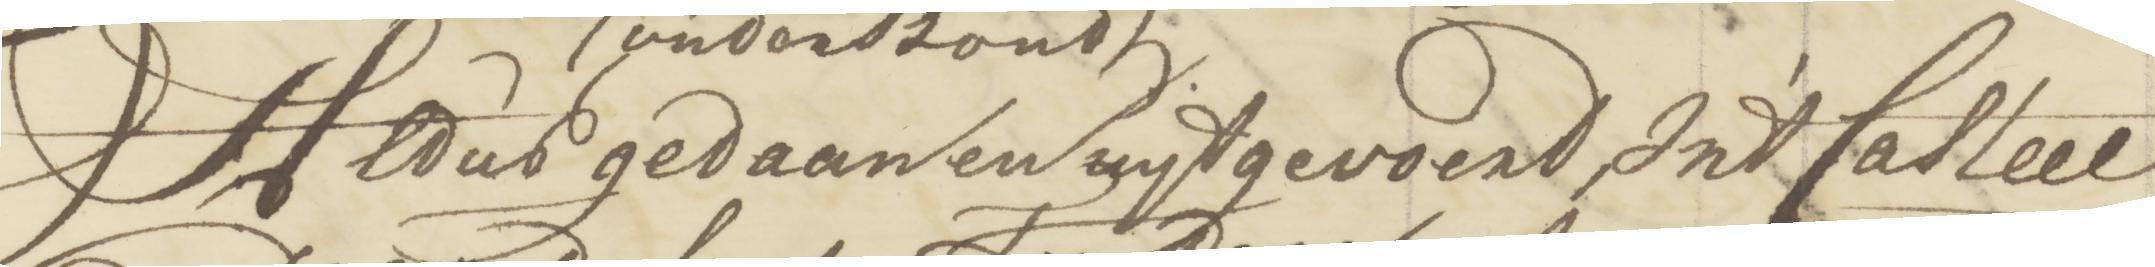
Aldus gedaan en uijtgevoerd, In't Casteel
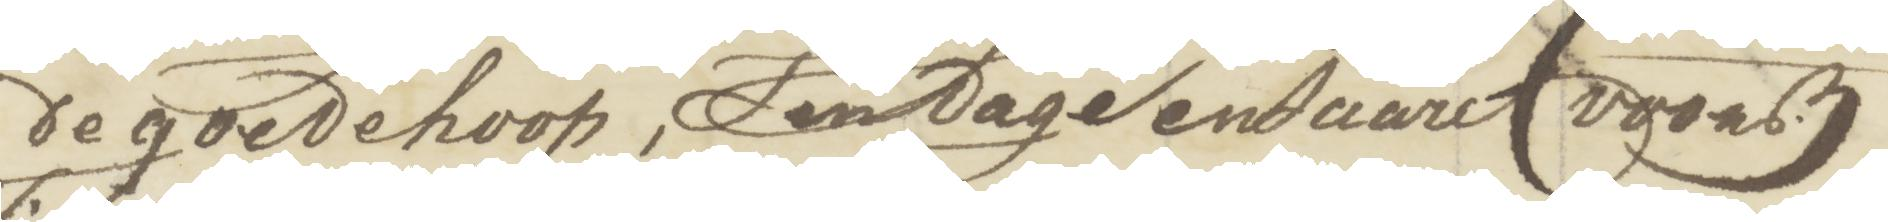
de goedehoop, Ten dage en Iaare voors.z
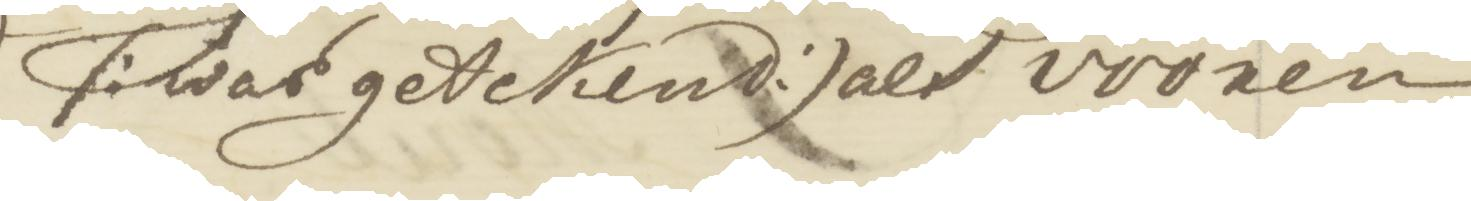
(: was getekend:) als vooren
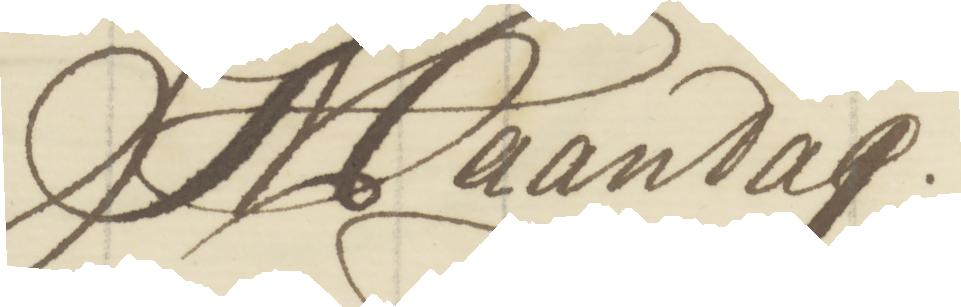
Maandag.
